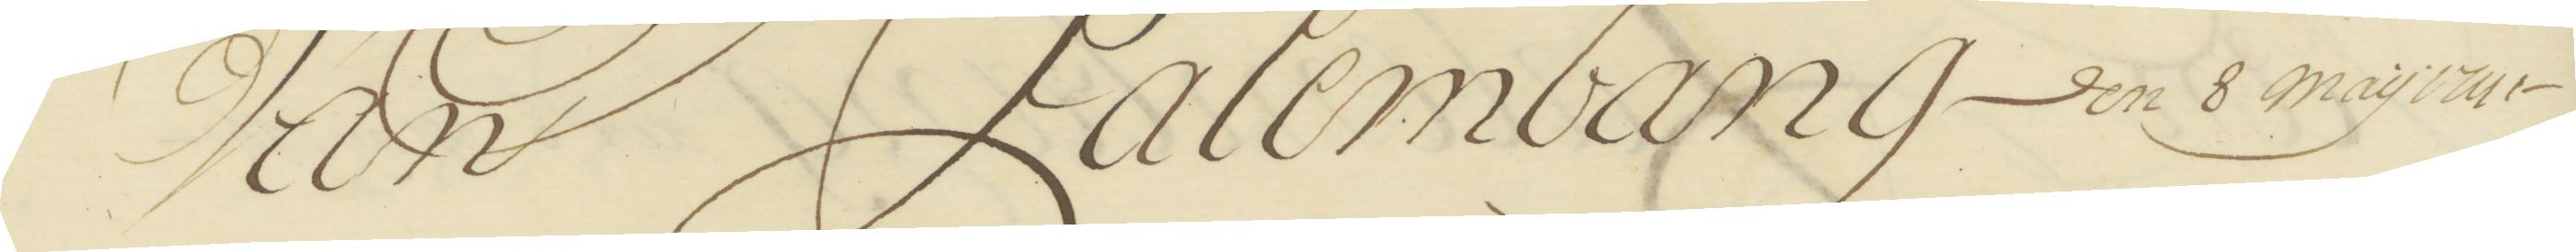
Van Palembang den 8 maij 1741 —
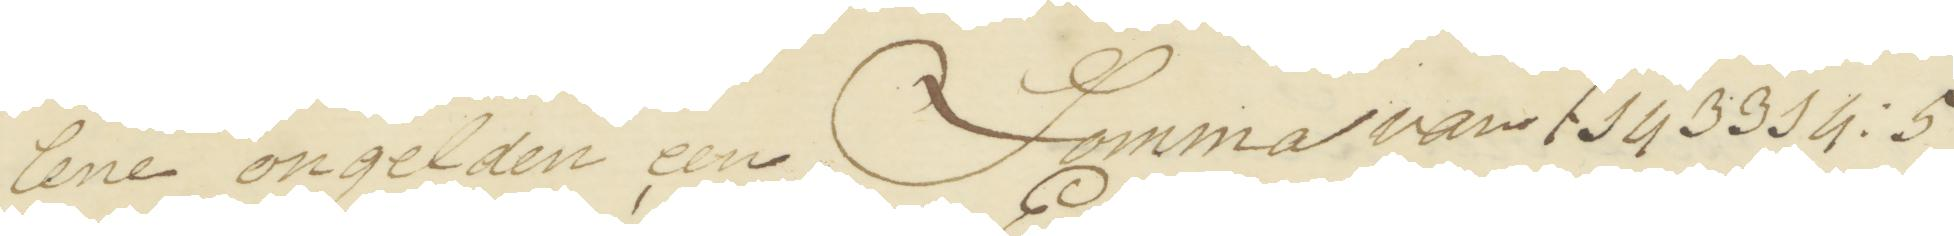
lene ongelden een Somma van ƒ 143314: 5
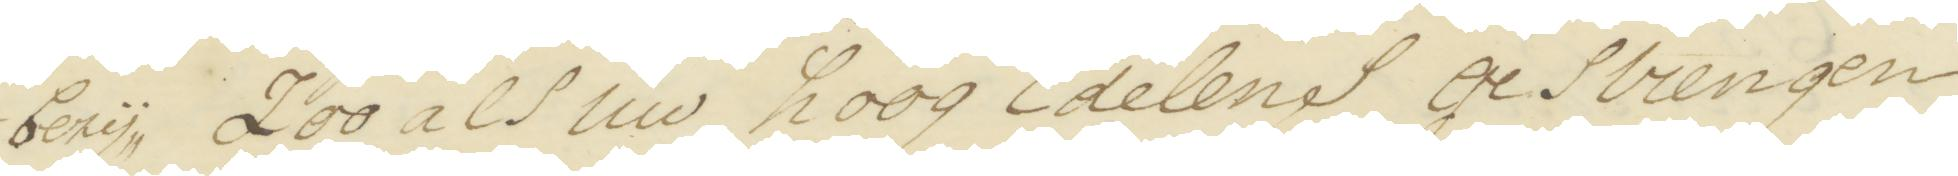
zoo als uw hoog Edelens gestrengen
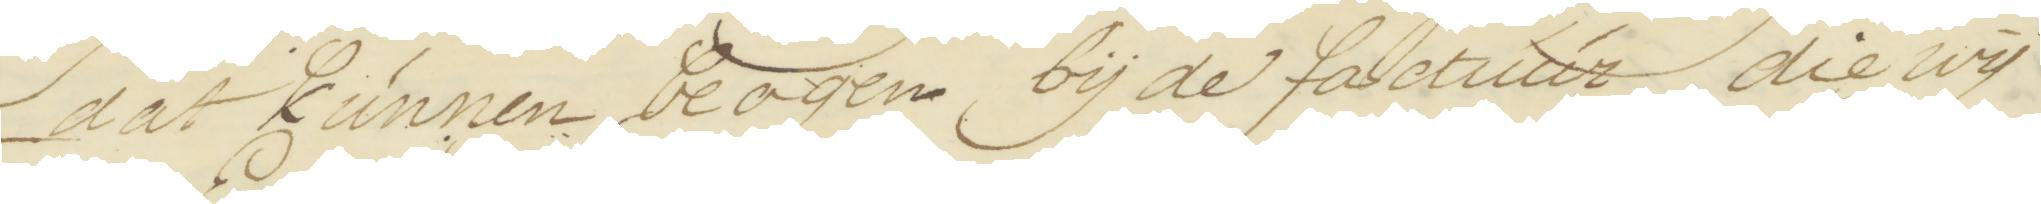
dat kunnen beogen bij de factuur die wij
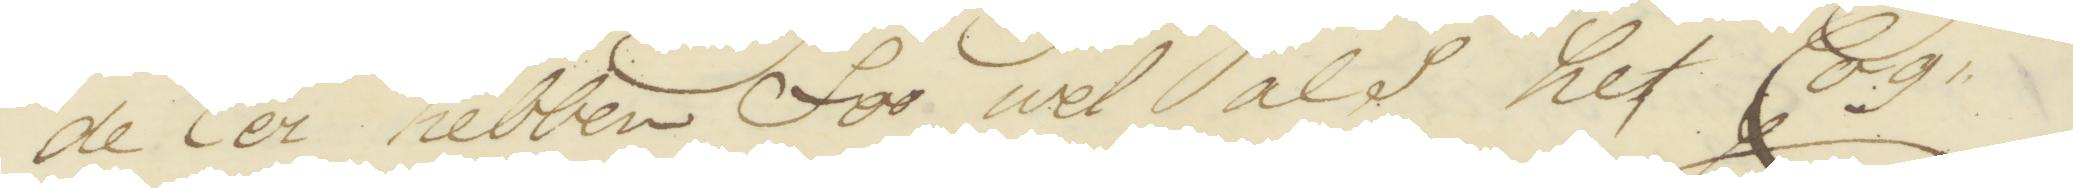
de Eer hebben soo wel als het Cog„
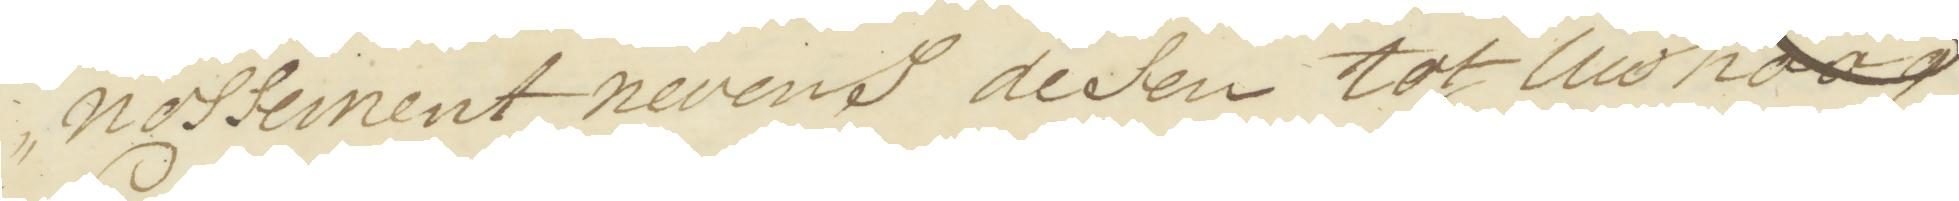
„nossement nevens desen tot uw hoog
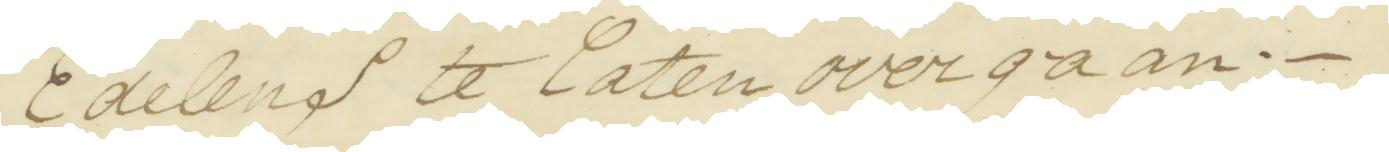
Edelens te laten overgaan.—
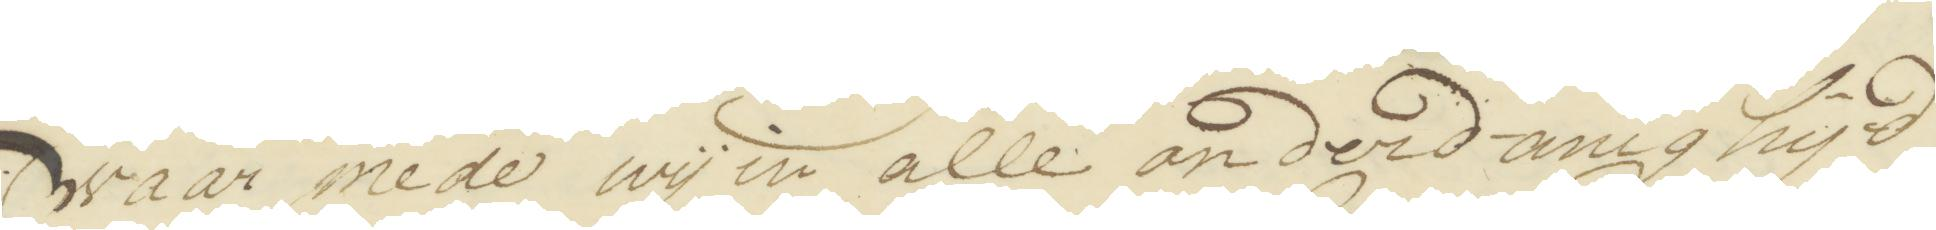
Waar mede wij in alle onderdanighijd
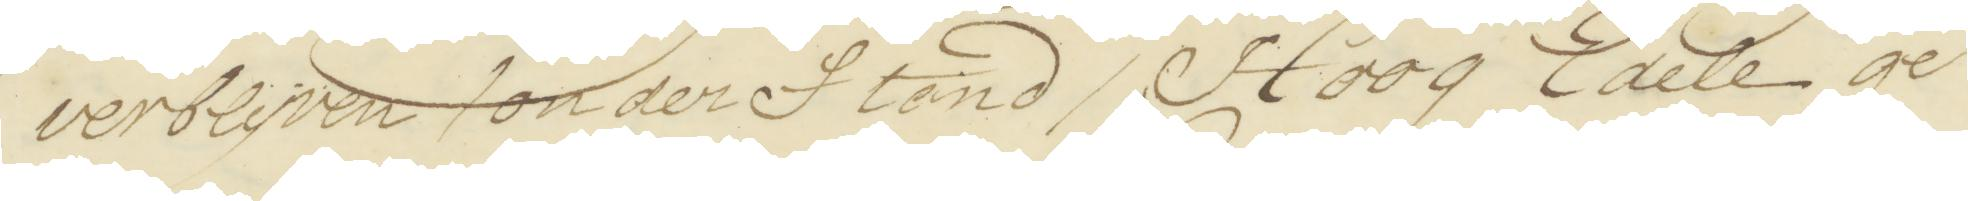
verblijven /onderstond/ Hoog Edele ge
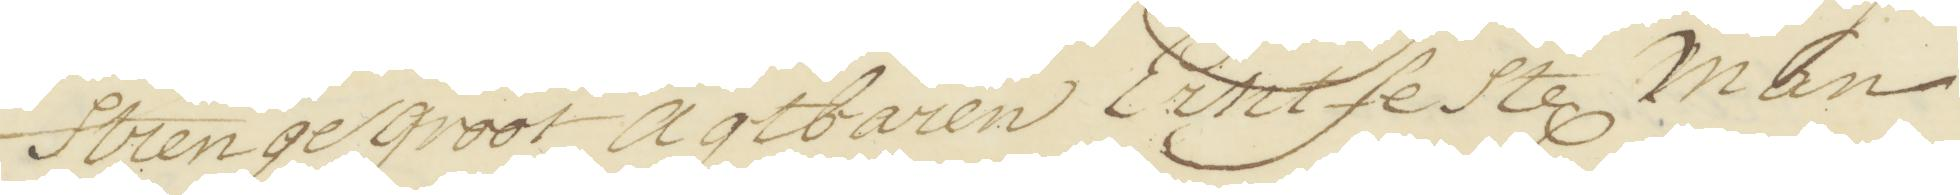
strenge groot Agtbaren Erntfeste Man
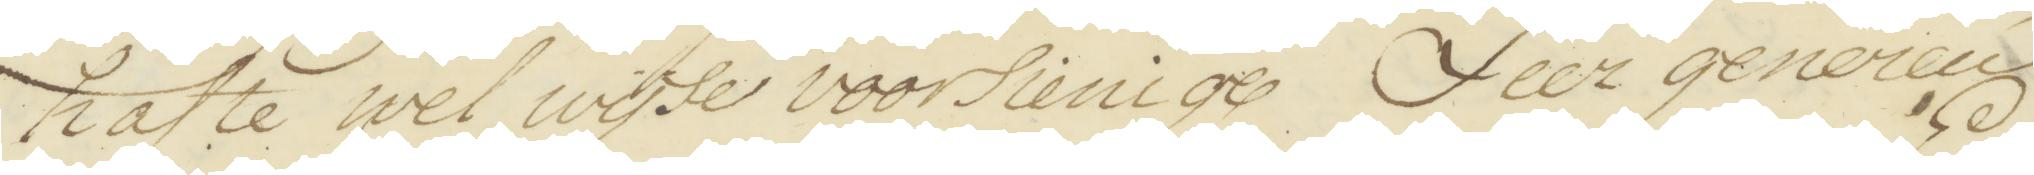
hafte wel wijse voorsienige Seer genereu
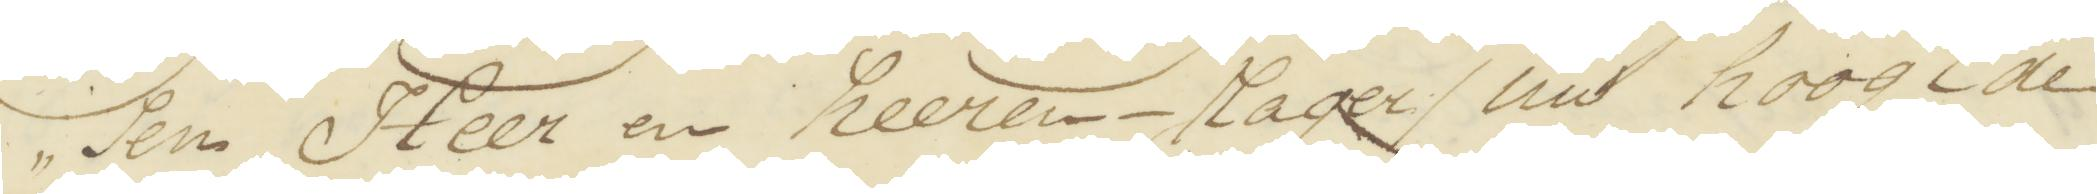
„sen Heer en heeren— /lager:/ uw hoog Ede
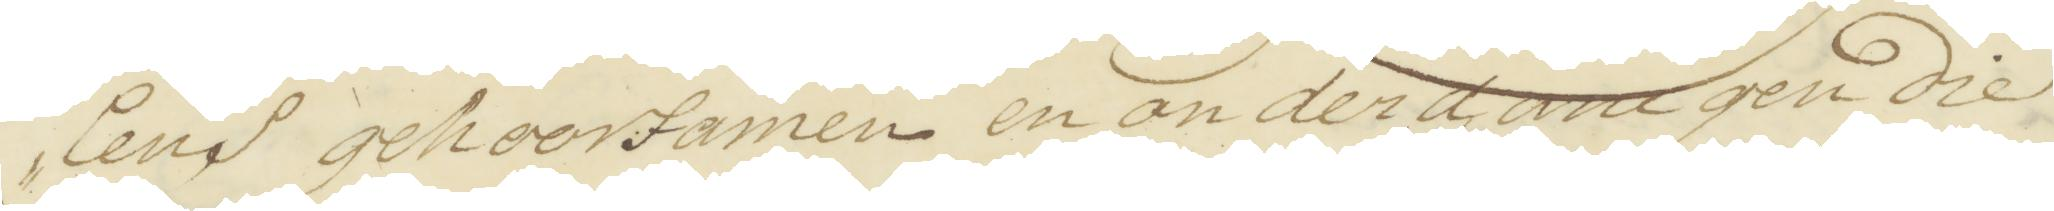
„lens gehoorsamen en onderdanigen die
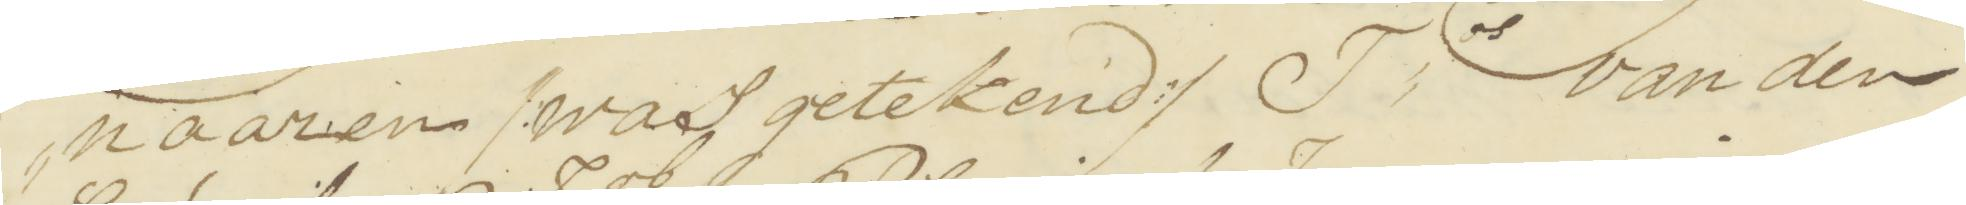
„naaren /:was getekend:/ I„es van den
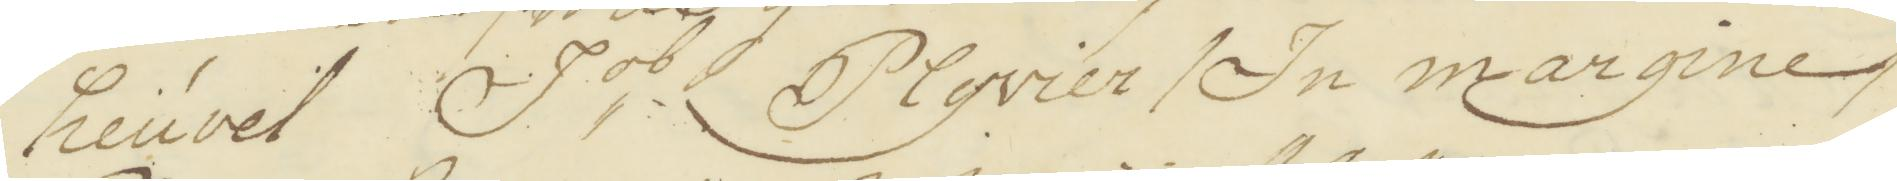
heuvel J„os Plyvier /In margine/
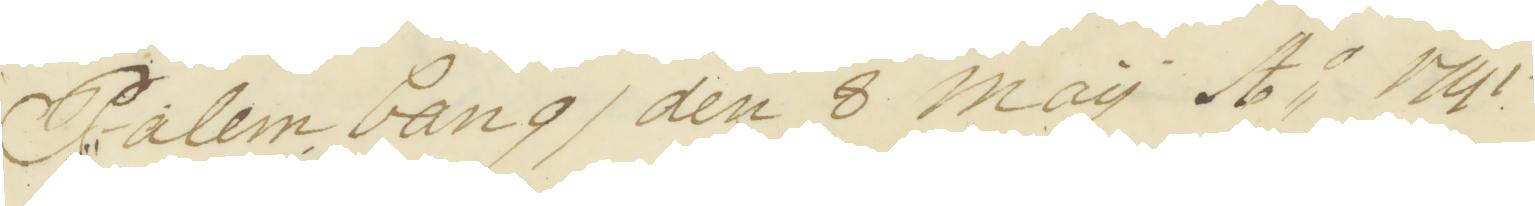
Palem bang, den 8 maij A„o 1741 —
